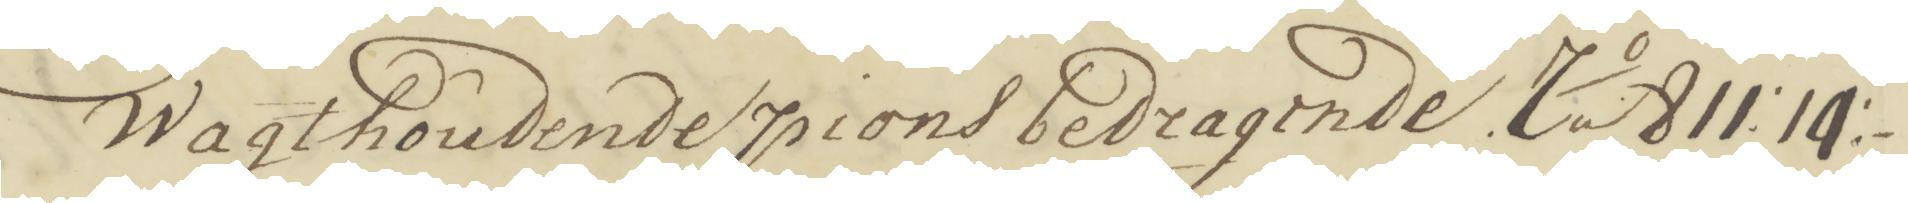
Wagthoudende pions bedragende r o/a 811:14:—
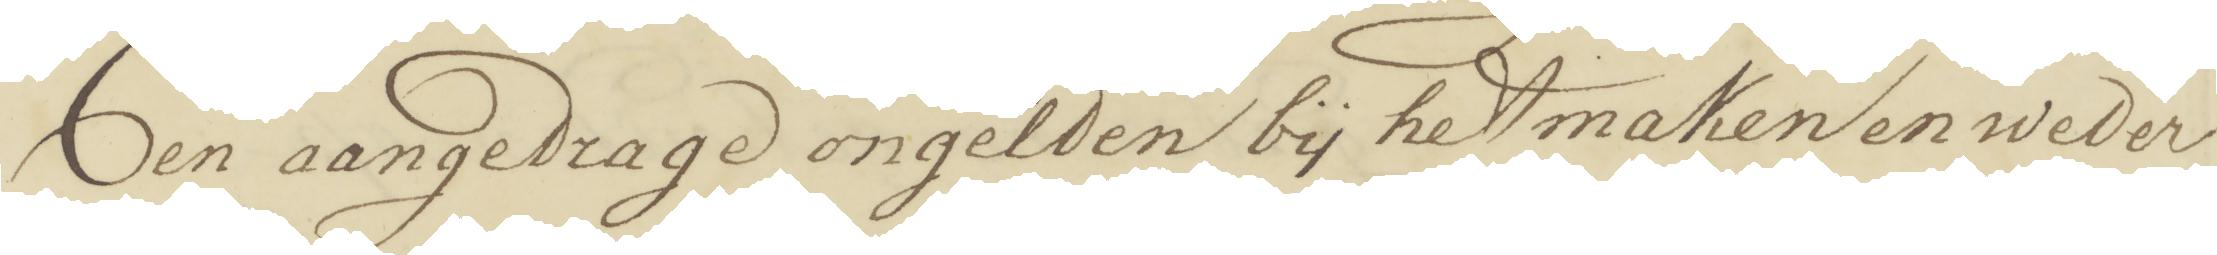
Een aangedrage ongelden bij het maken en weder
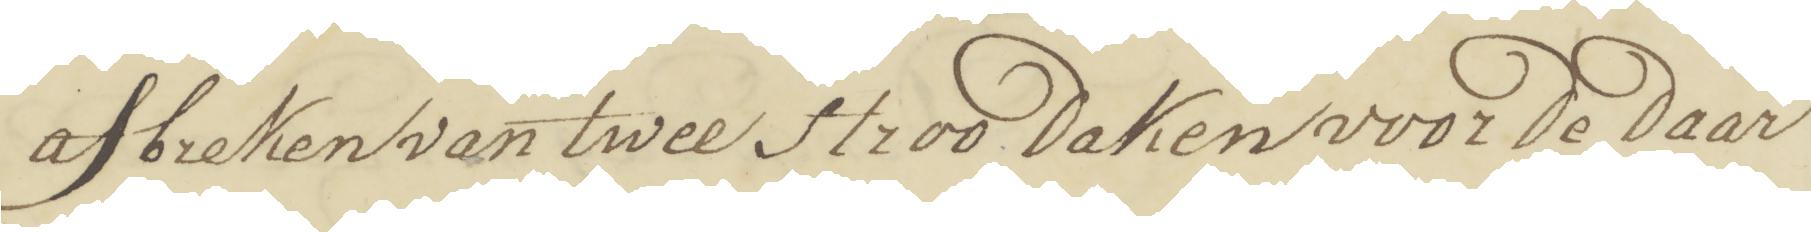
afbreken van twee stroo daken voor de daar
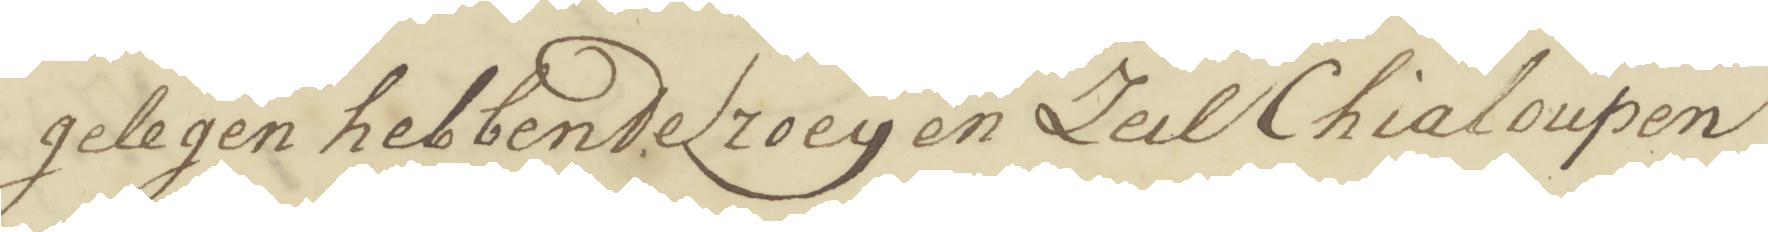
gelegen hebbende roeij en Zeil Chialoupen
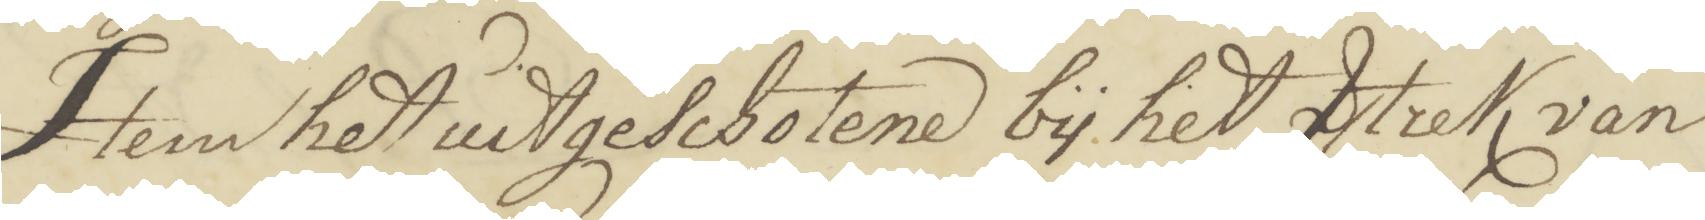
Item het uitgeschotene bij het vertrek van
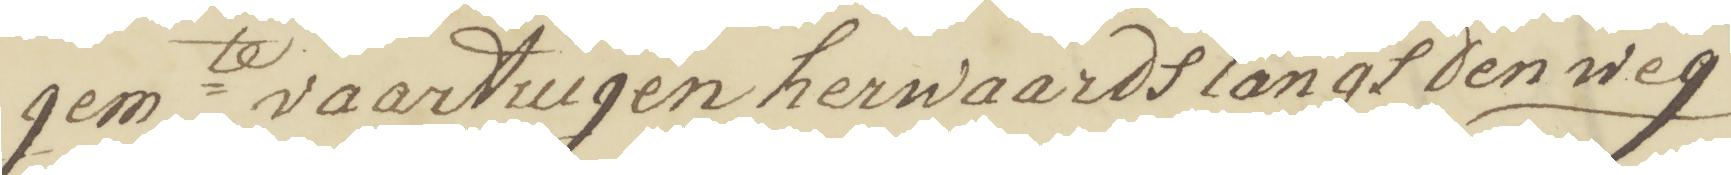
gem:te vaartuigen herwaards langs den weg
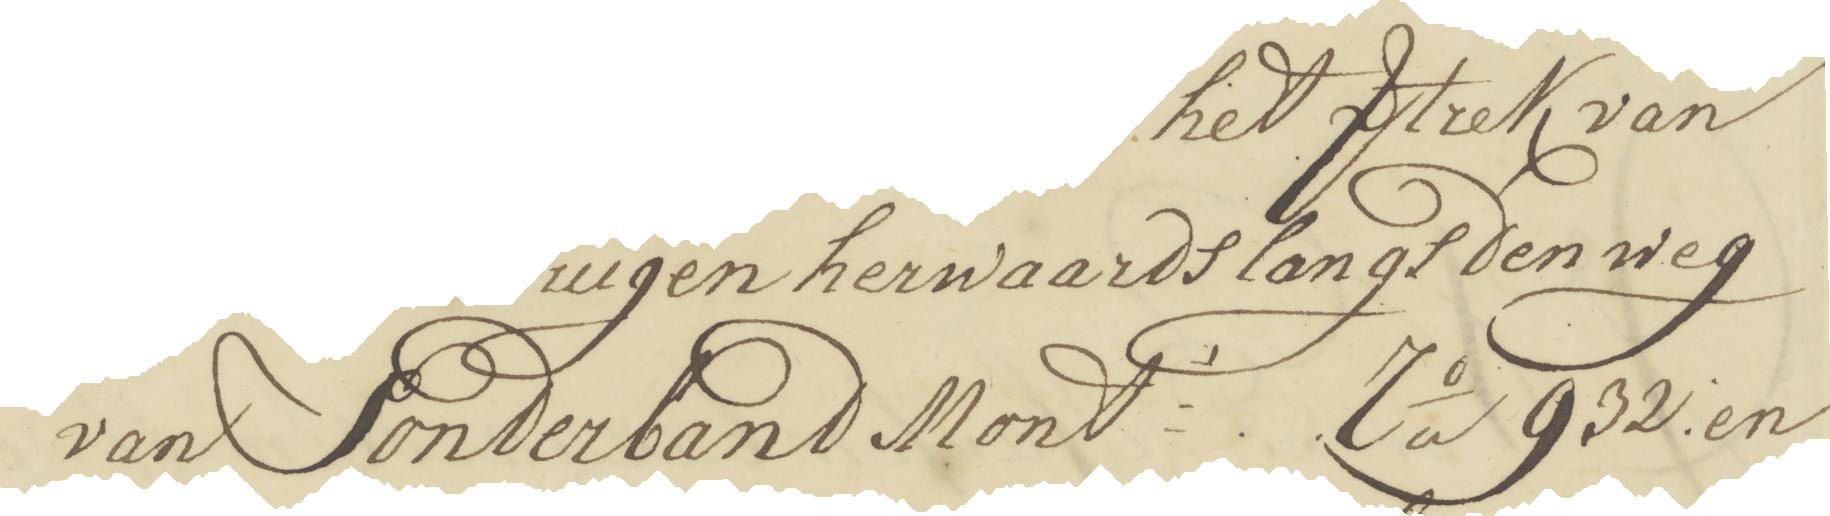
van Sonderband Mont:' R o/a 932: en
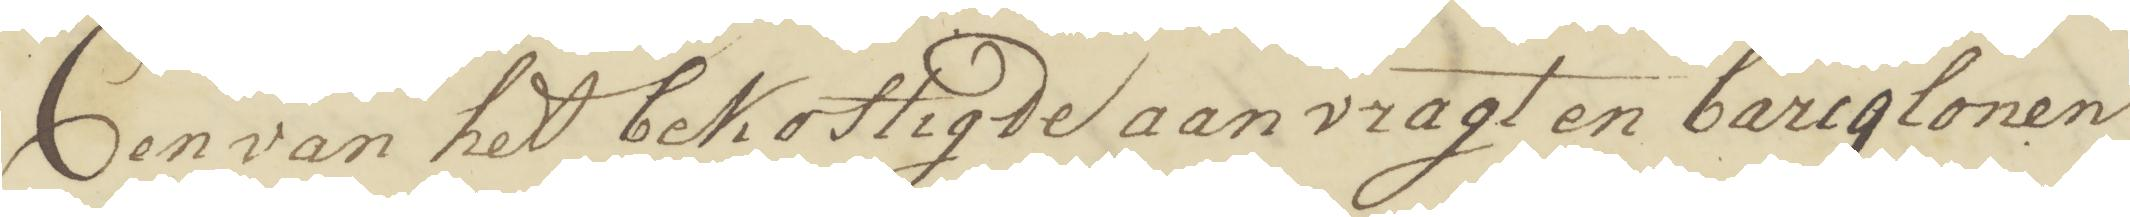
Een van het bekostigde aan vragt en barcqlonen
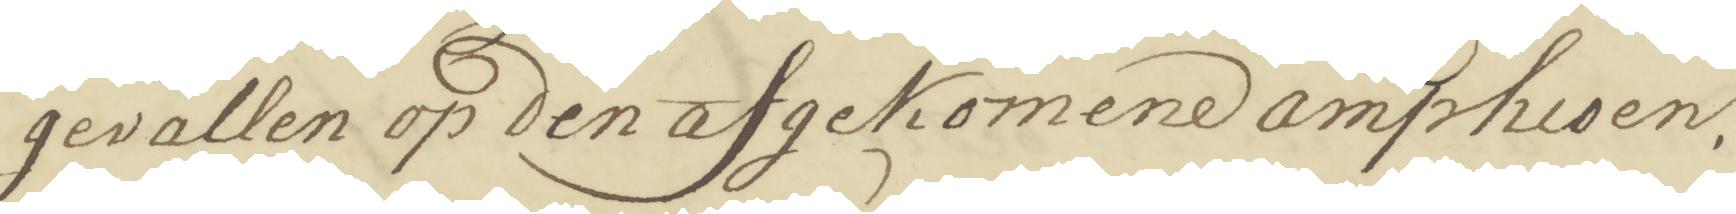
gevallen op den afgekomene amphioen,
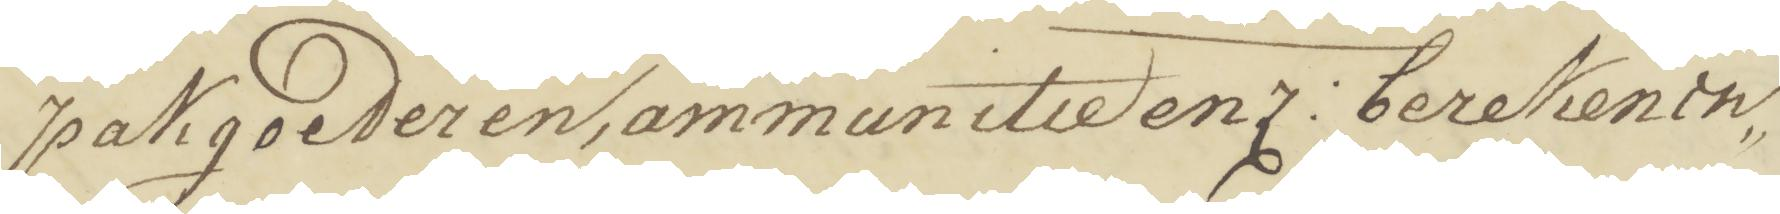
pakgoederen, ammunitie enz: berekenen„
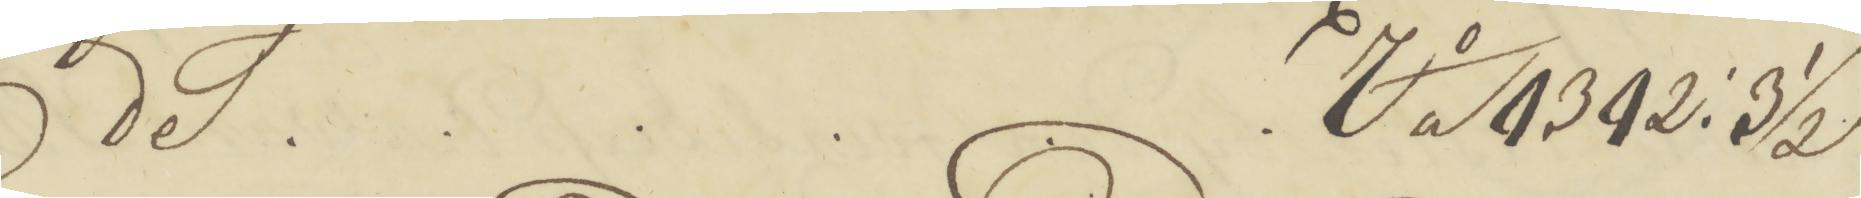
de . . . . . . R:o/a 4.342: 3½
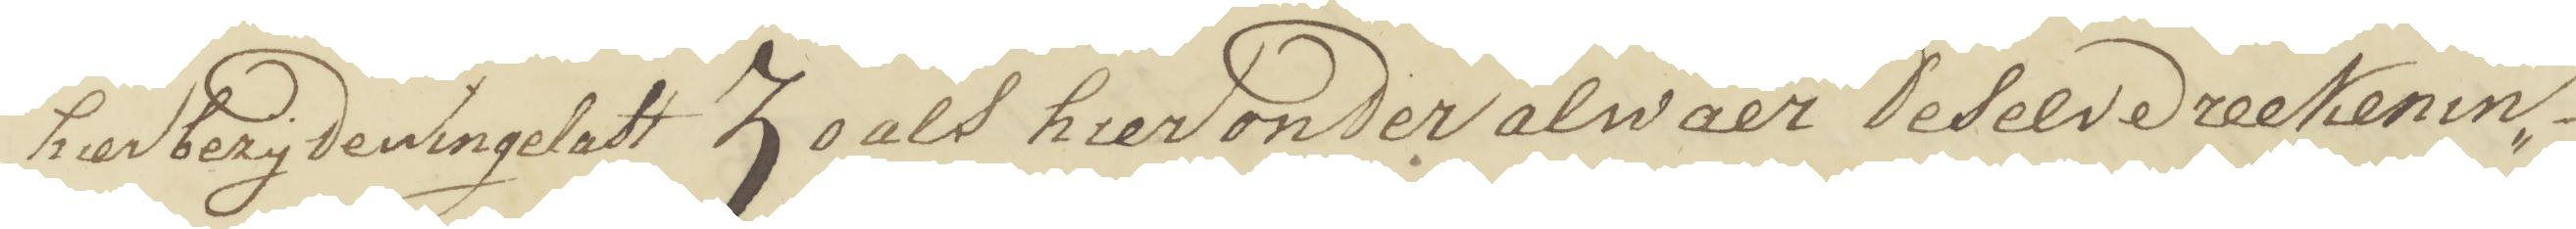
hier bezijden ingelast Zoals hier onder alwaer deselve reekenin„
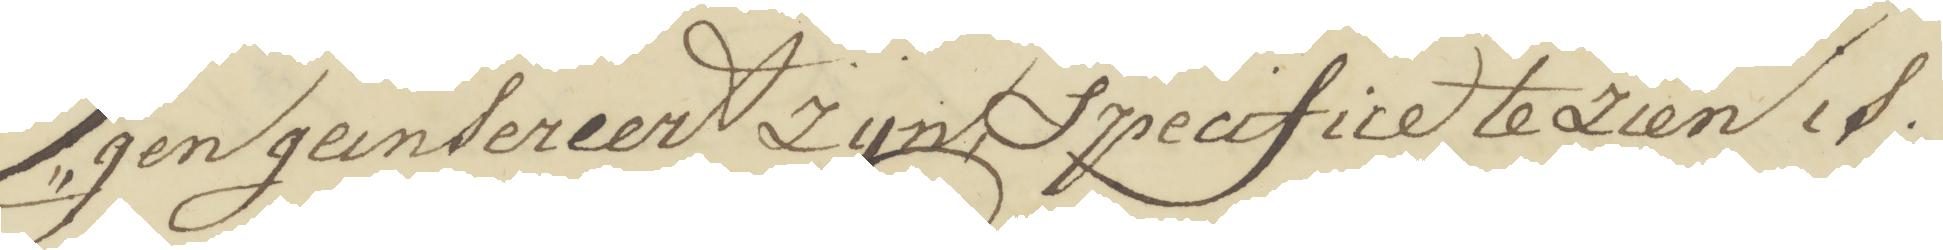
„gen geinsereer zijn Specifice te zien is.
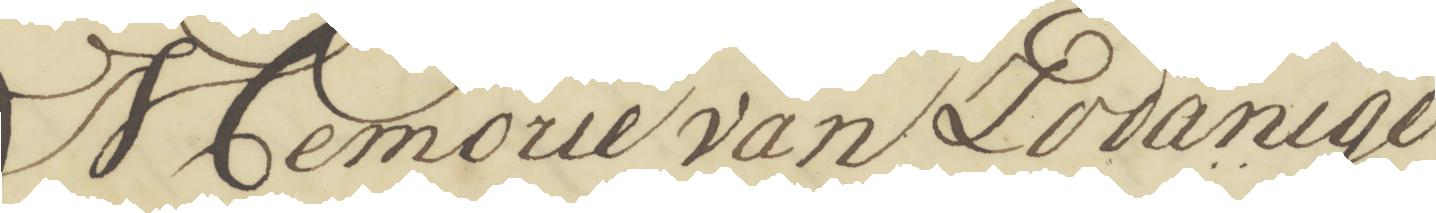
Memorie van Zodanige
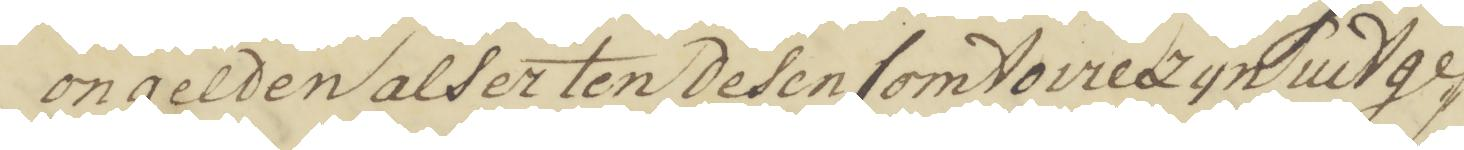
ongelden als er ten desen comtoire zijn uit ge„
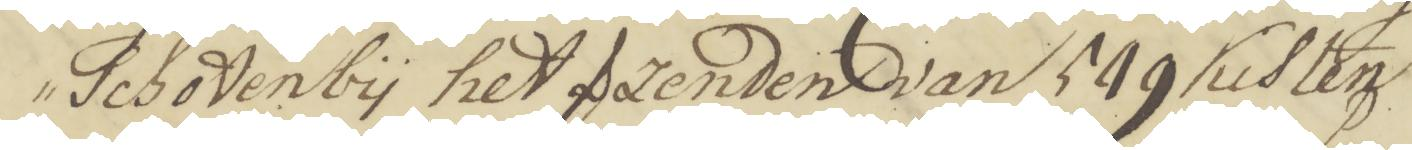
„schoten bij het verzenden van 549 kisten
